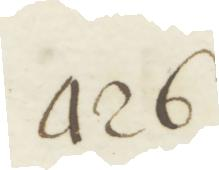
426
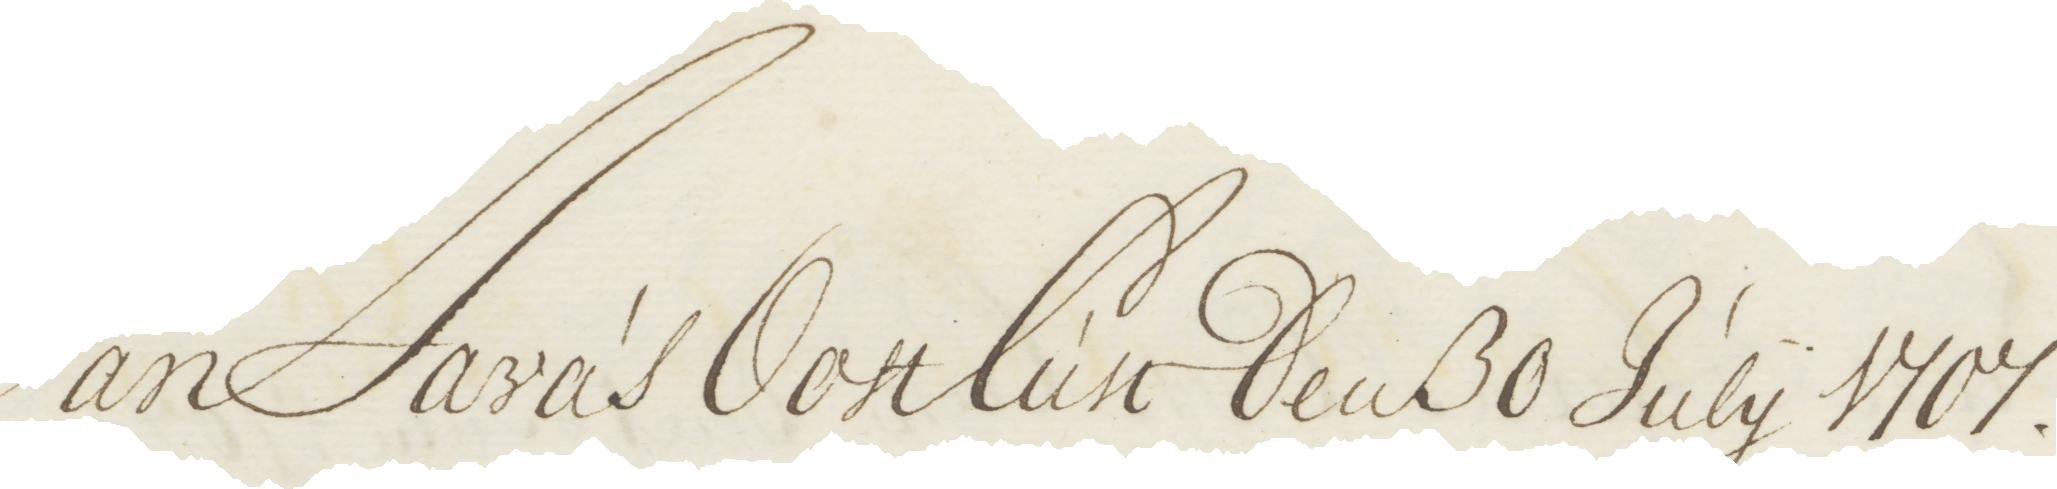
Van Iava's Oost Cust den 30 Julij 1707.
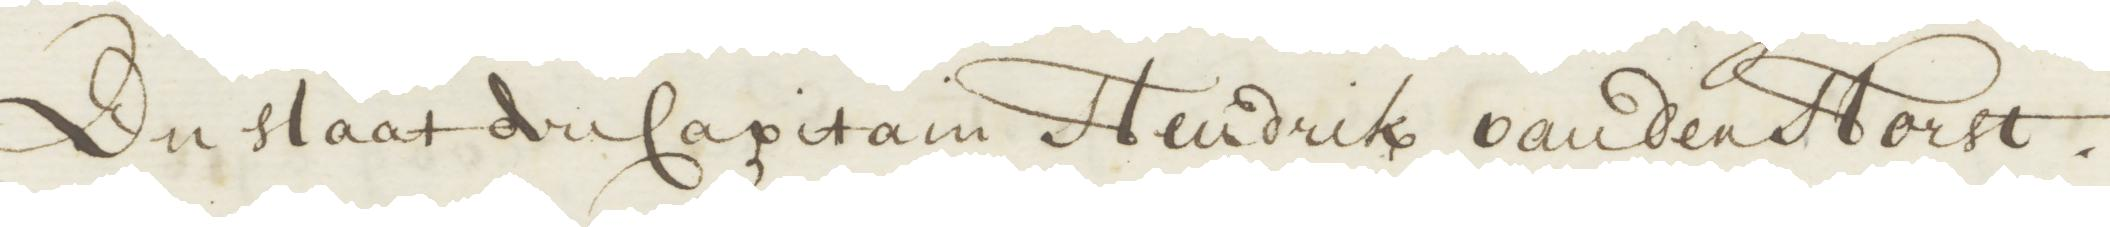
En staat den Capitain Hendrik van der Horst.
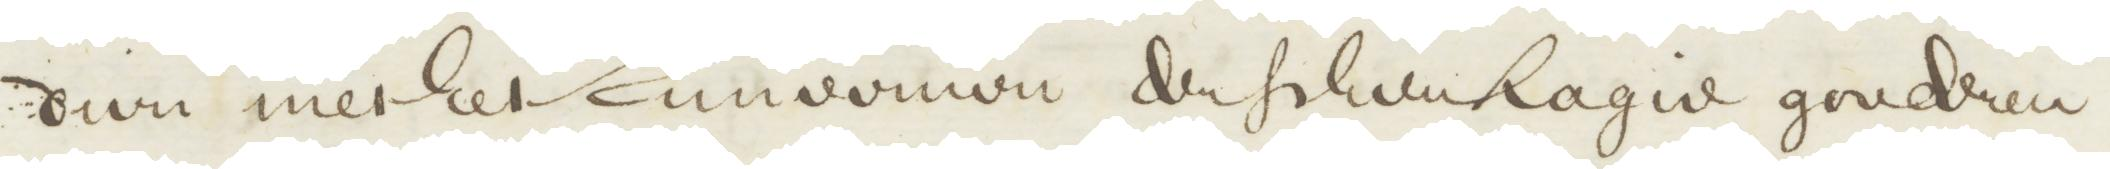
dien met het Anneemen der schenkagie goederen
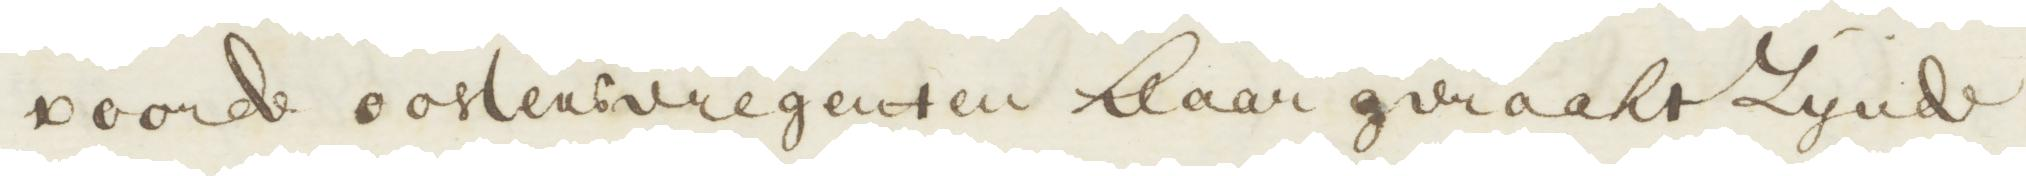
voorde oosterse regenten klaar geraakt zijnde
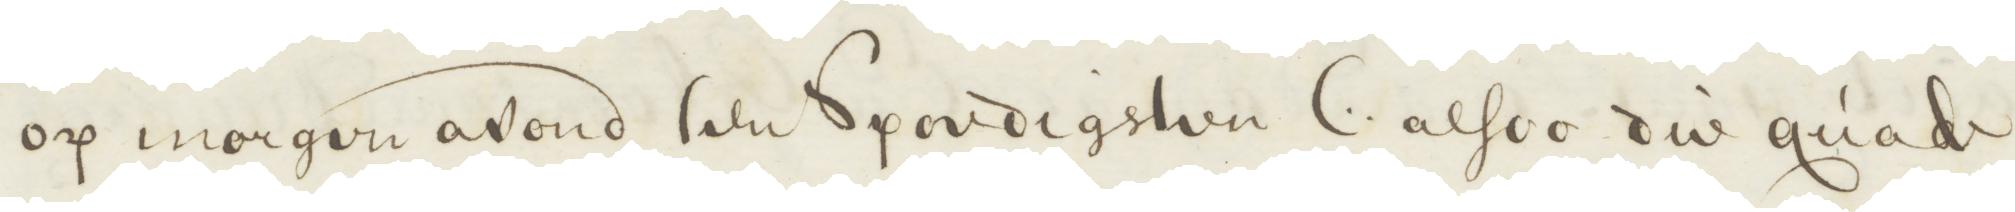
op morgen avond ten spoedigsten (:alsoo die quade
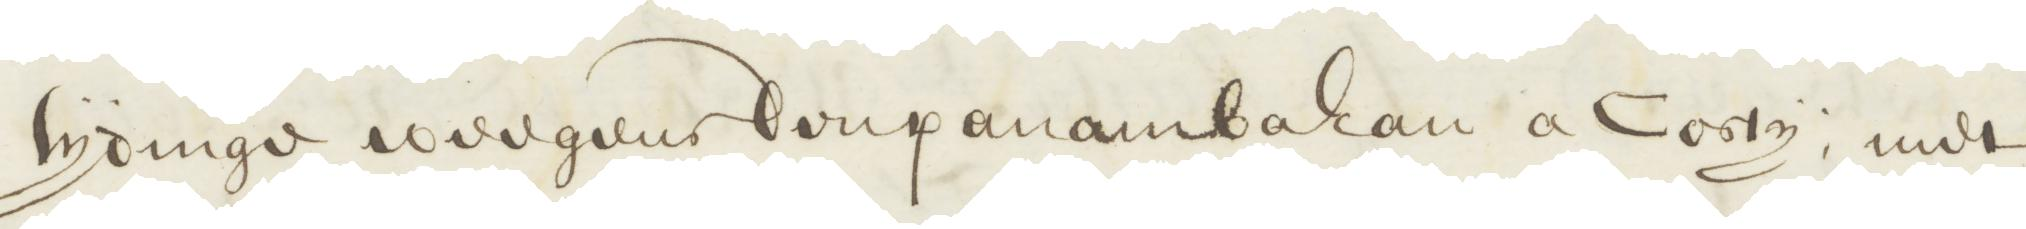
tijdinge weegens den panambahan a Costij, met
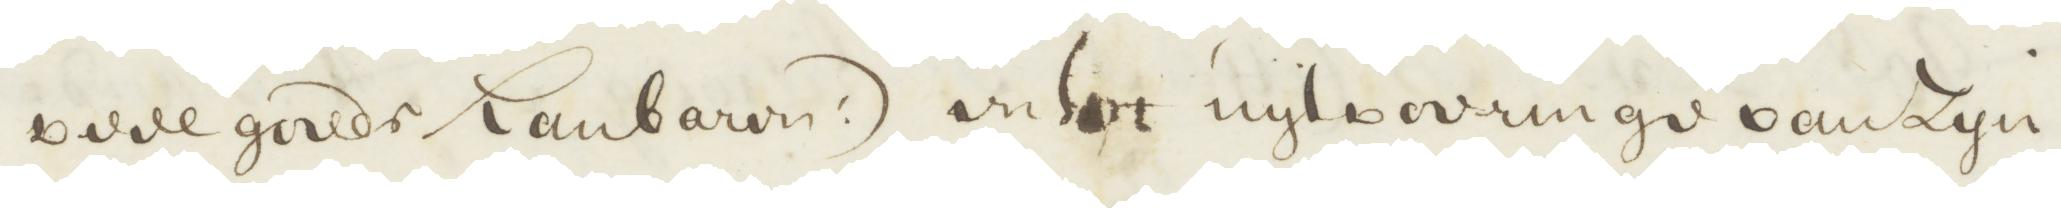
veel goeds kanbaren:) en tot uijtvoeringe van zyn
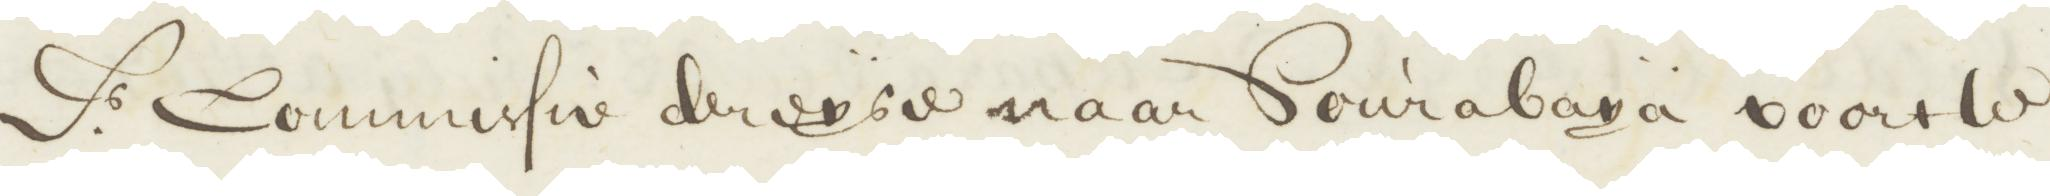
E.s Commissie der eijse naar Sourabaija voort te
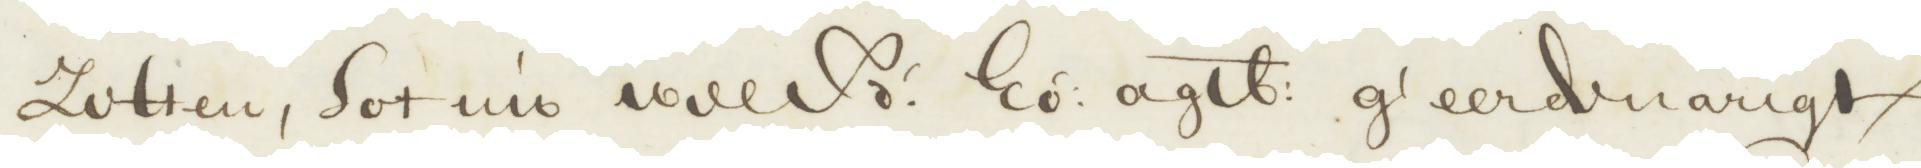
zetten, tot uw wel Ed: ho. agtb: g’eerdenarigt
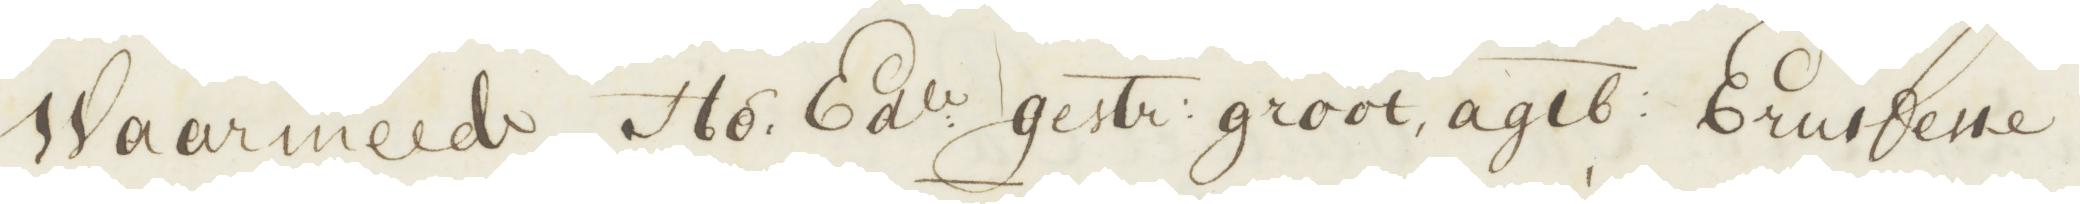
Waarmeede, Ho. Ed:le gestr: groot, agtb: Erntfeste
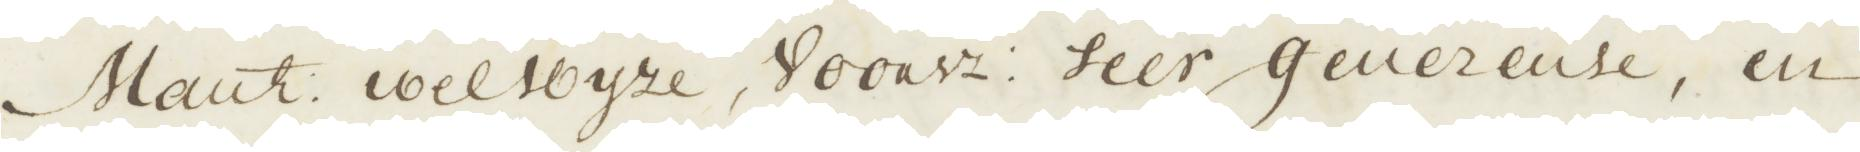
Manh: wel wijze, voorsz: seer genereuse, en
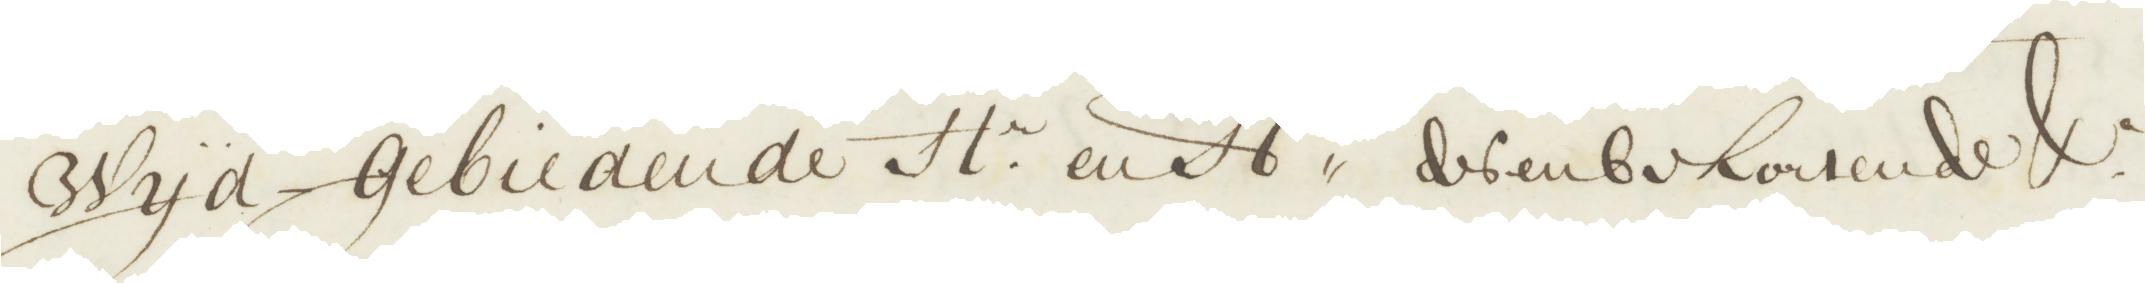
wijd-gebiedende H.r en H„ desen bekortende &.a
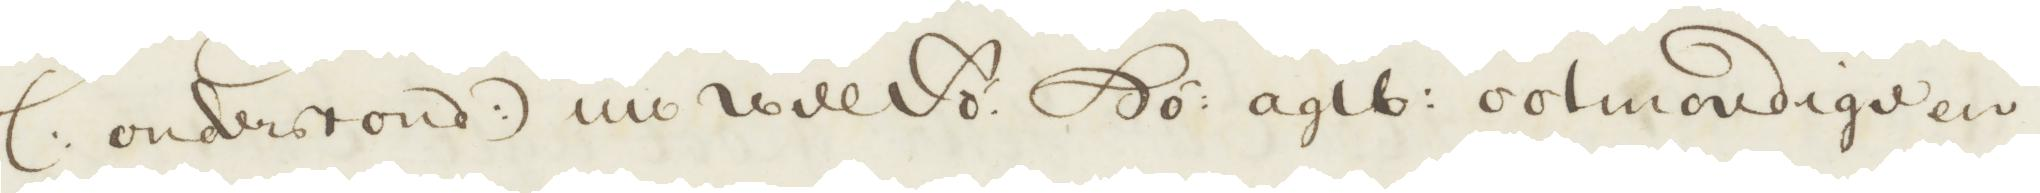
(: onderstond:) uw wel Ed: Ho: agtb: ootmoedige en
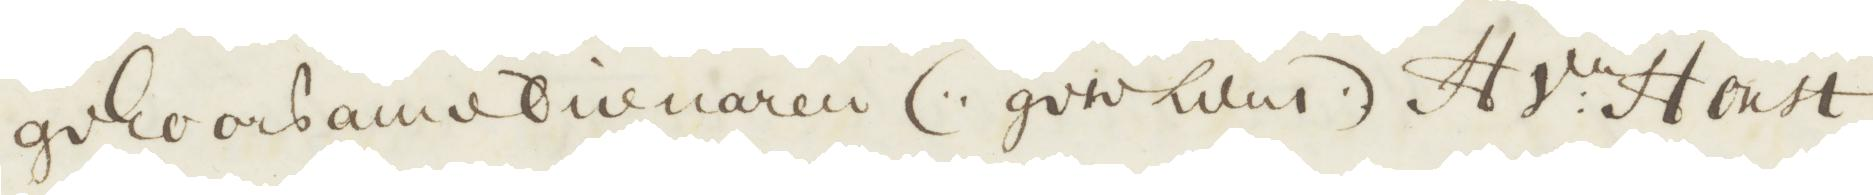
gehoorsame dienaren (:getekent:) H:ren Horst
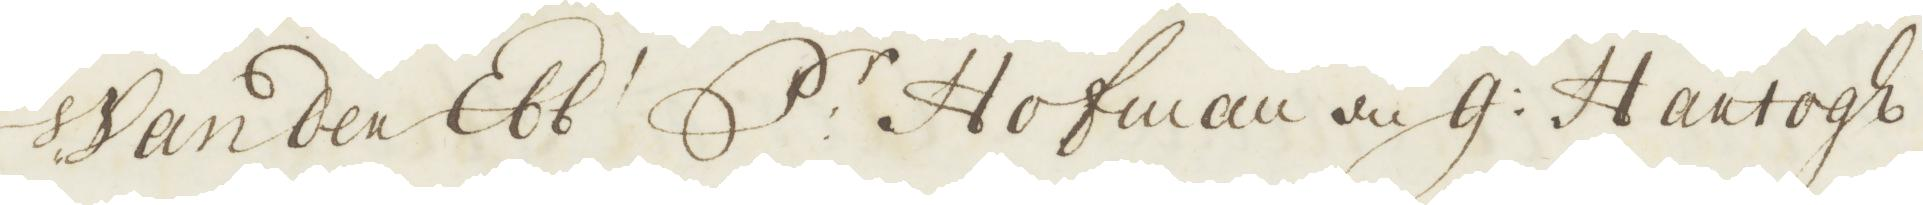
s„ van der Ebb' d:r Hofman en g: Hartogh
